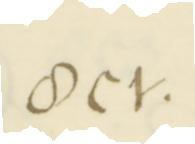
851.
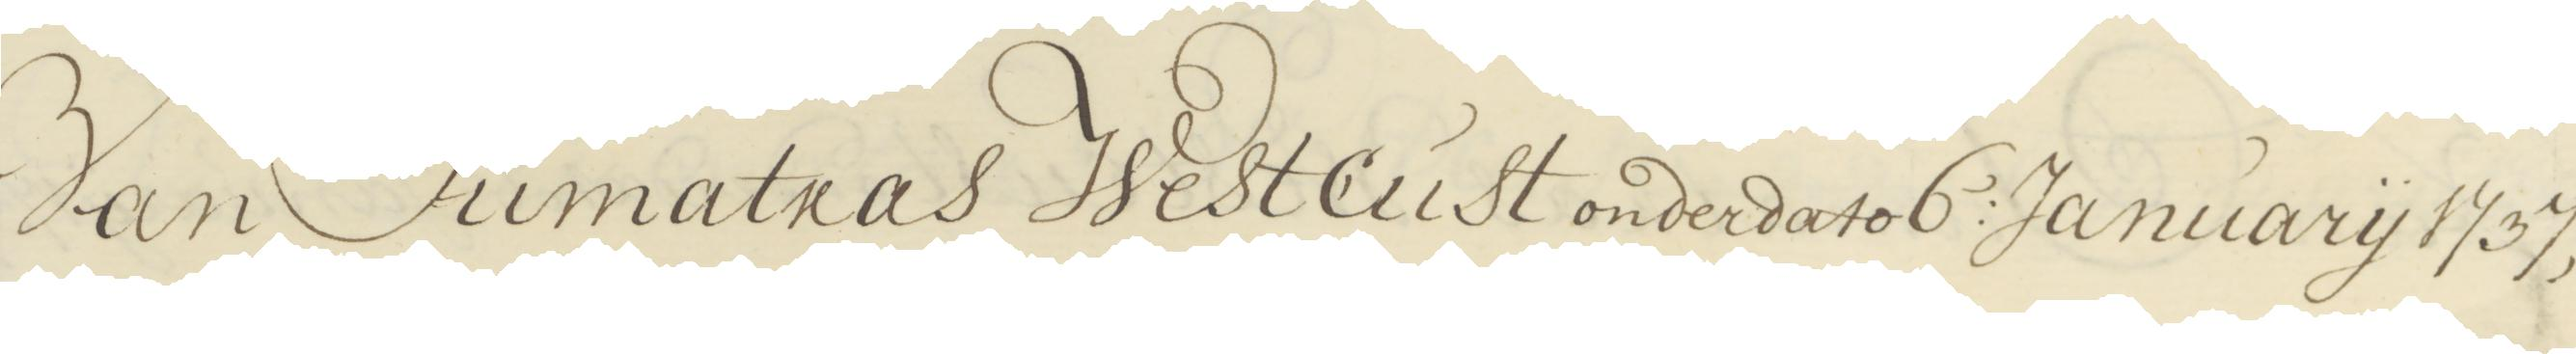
Van Sumatras West cust onder dato 6:' Januarij 1737;
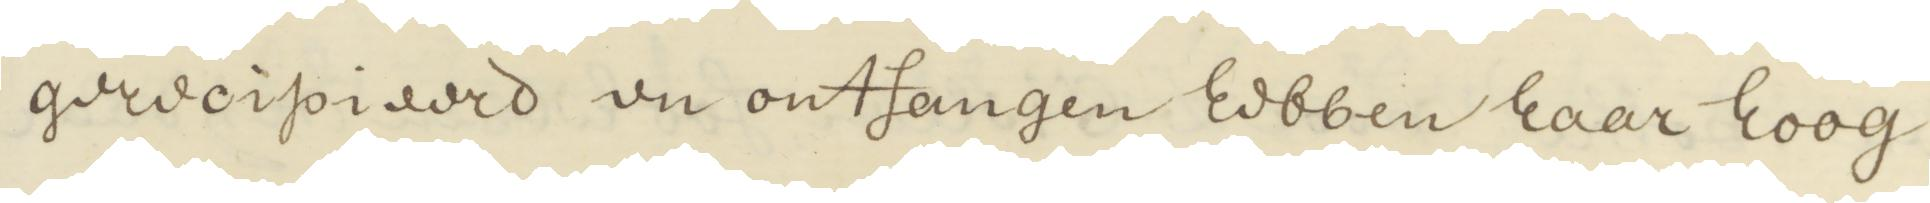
gerecipieerd en ontfangen hebben haar hoog
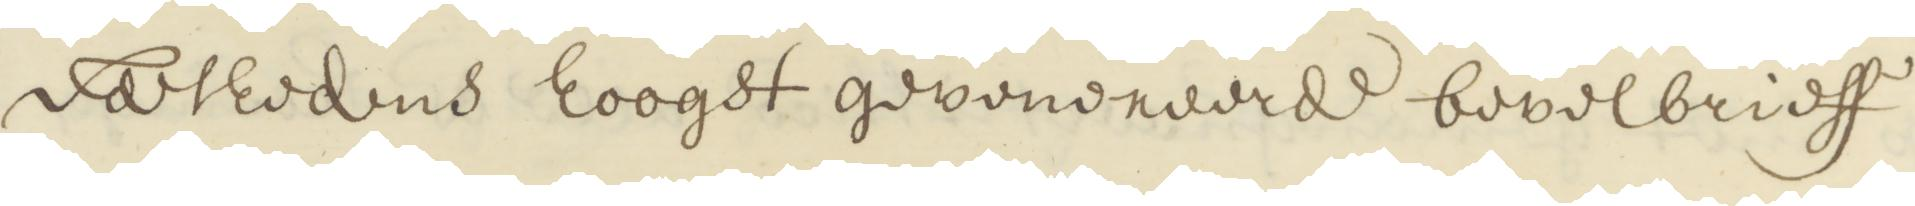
Edelhedens hoogst gevenereerde bevelbrieff
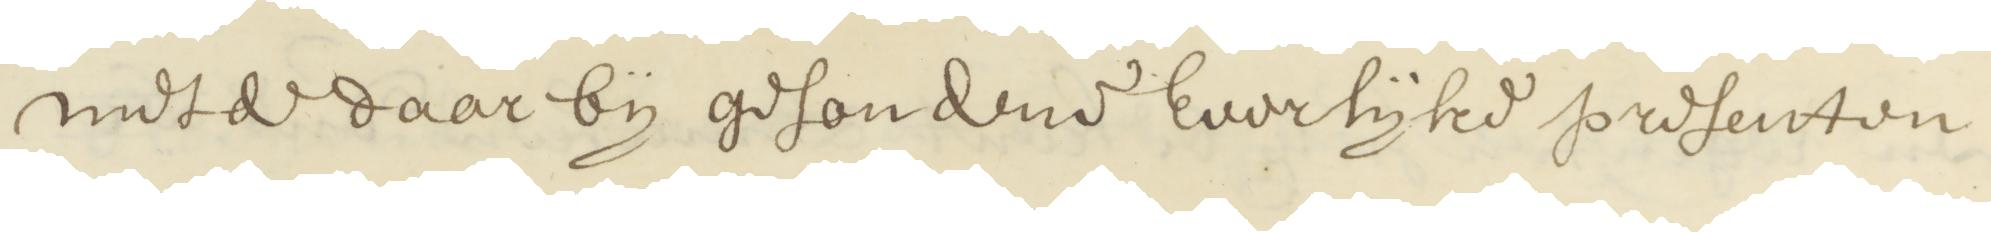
met de daar bij gesondene heerlijke presenten
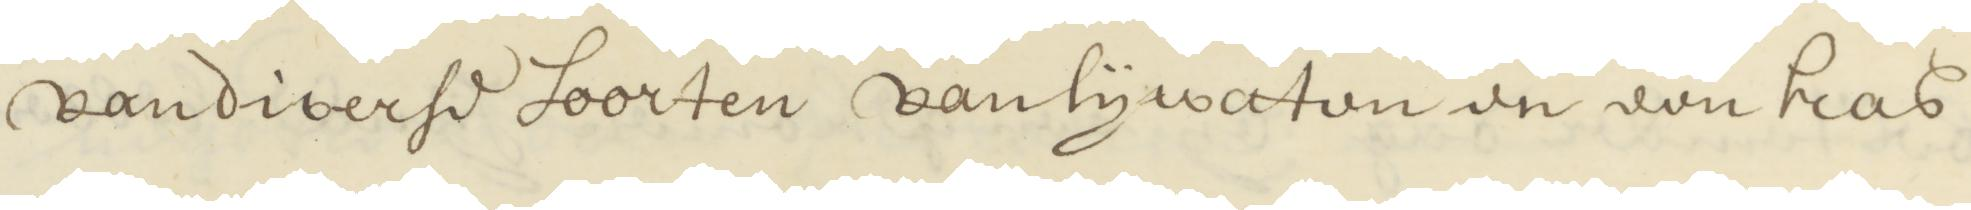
van diverse soorten van lijwaten en een kas
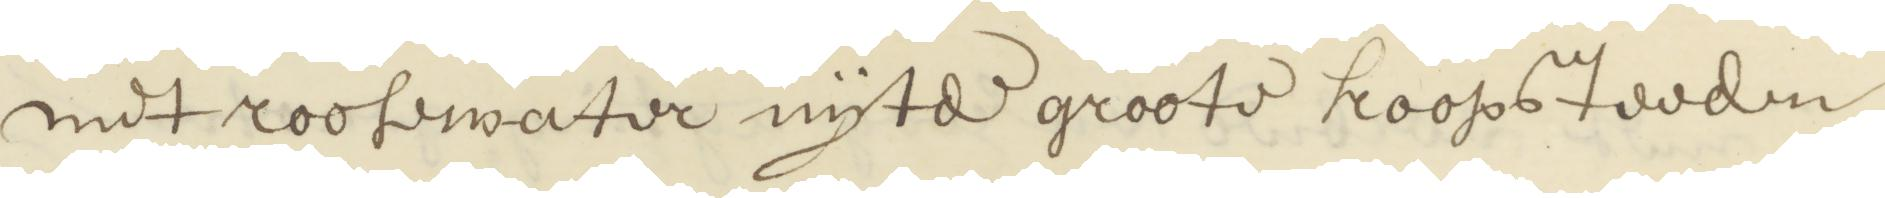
met roosewater uijtde groote koopsteeden
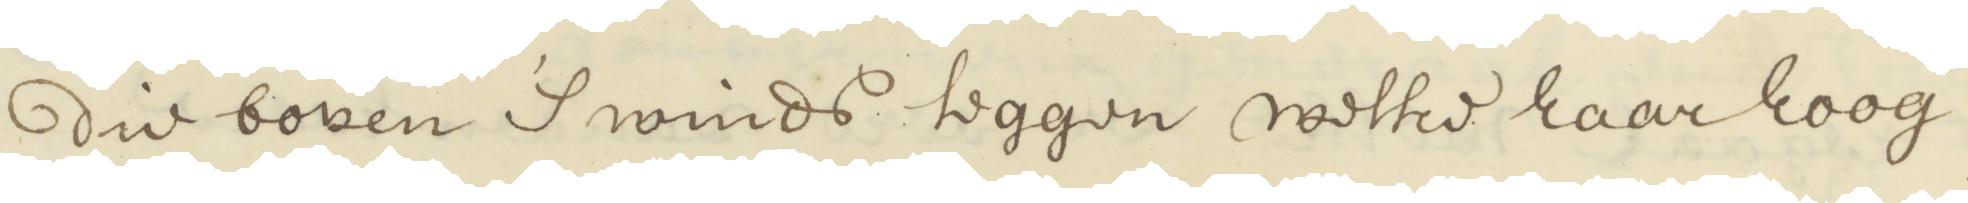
die boven 's winds leggen welke haar hoog
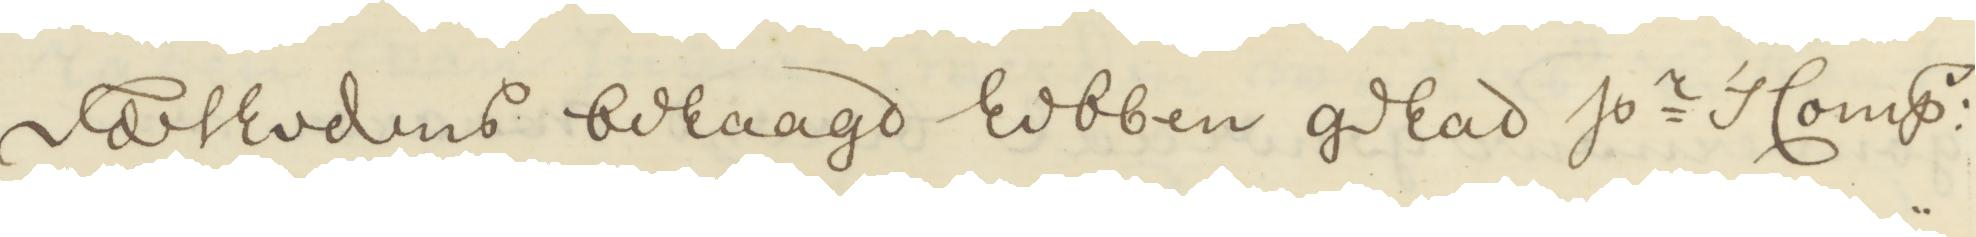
Edelhedens belaagd hebben gehad p=r ’s Comp:s
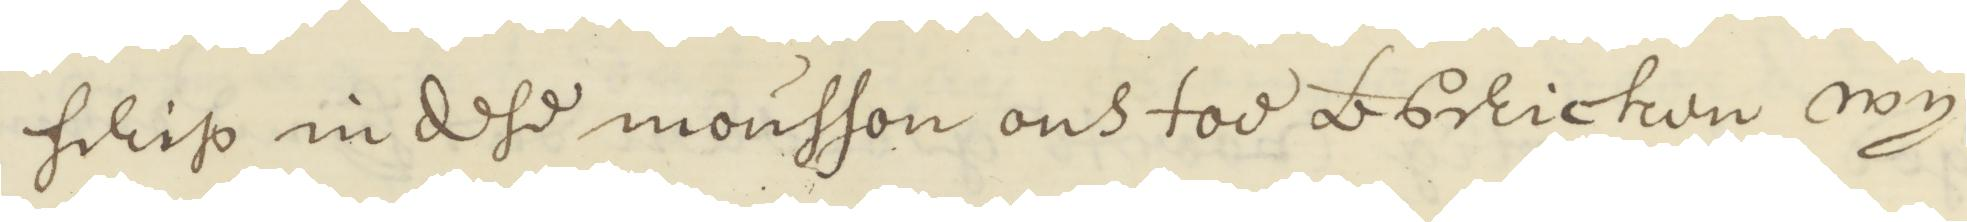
schip in dese mousson ons toe te schicken wij
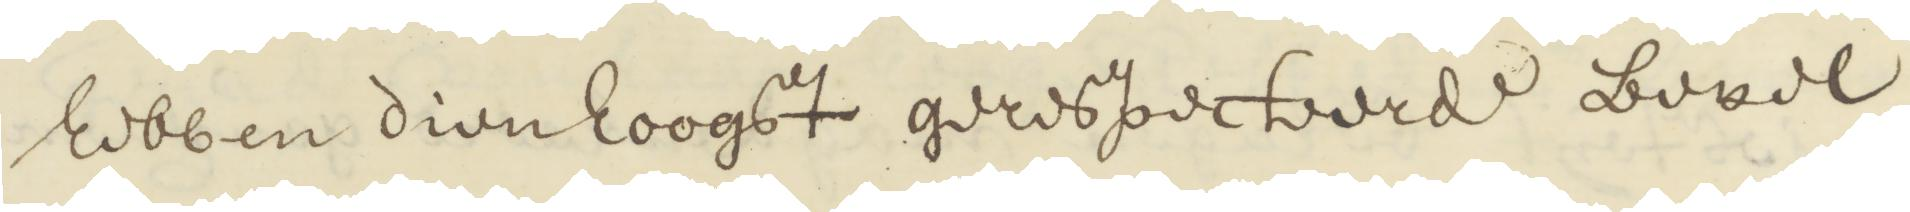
hebben dien hoogst gerespecteerde bevel
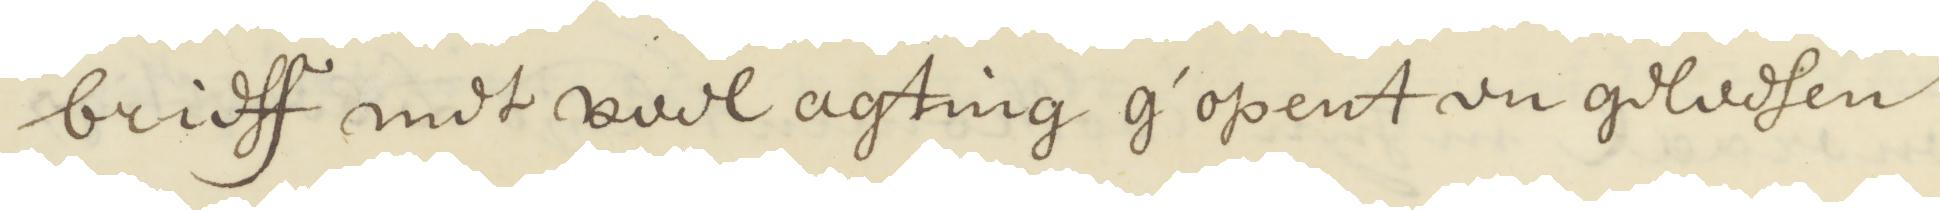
brieff met veel agting g’opent en geleesen
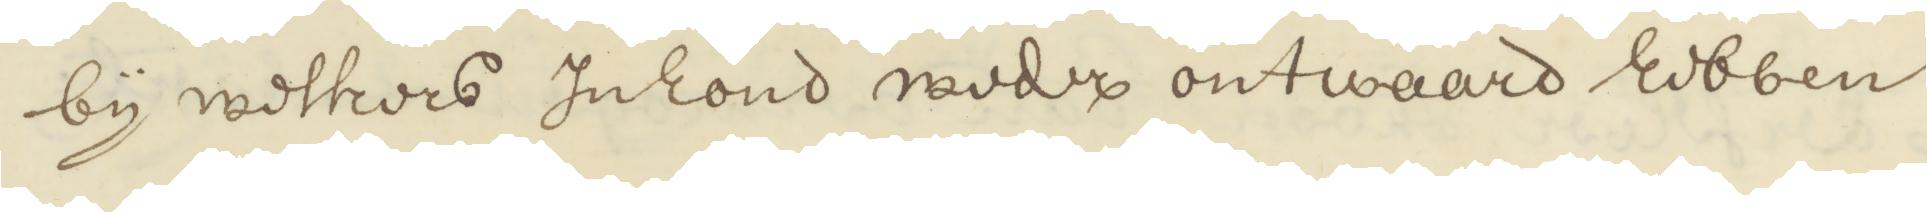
bij welkers Jnhoud weder ontwaard hebben
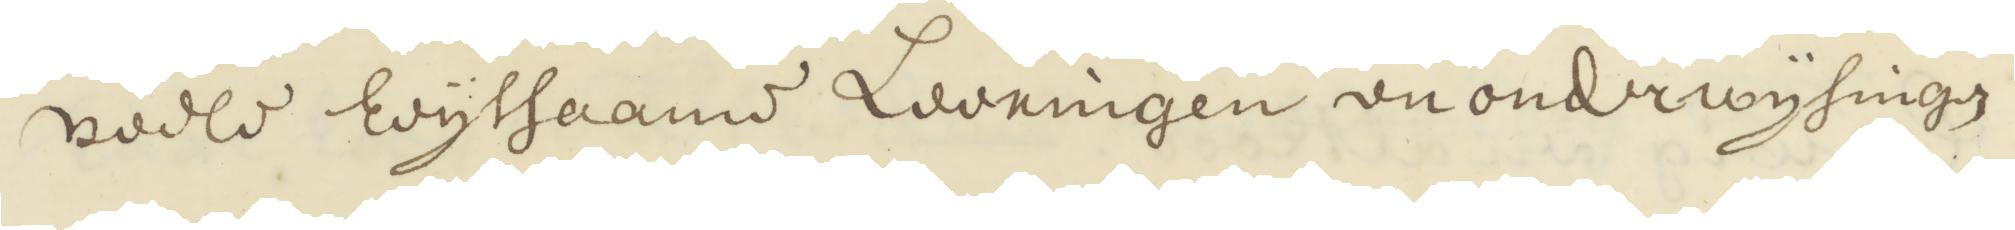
veele heijlsaame Leeringen en onderwijsingen
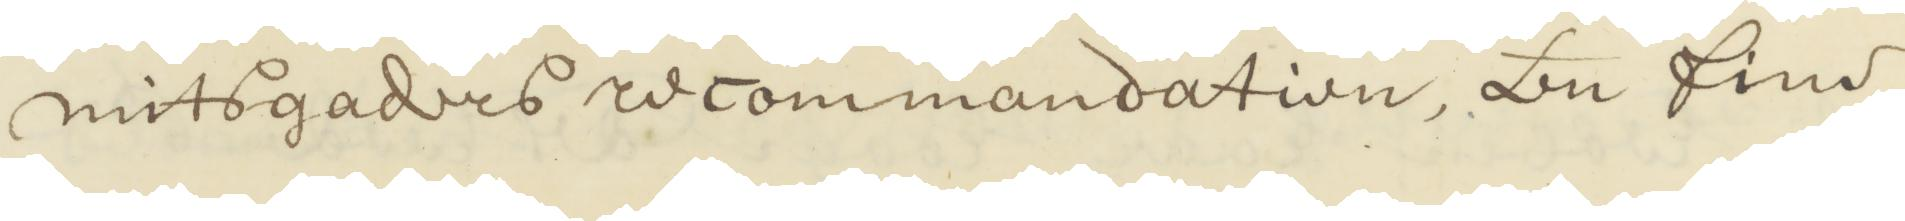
mitsgaders recommandatien, ten fine
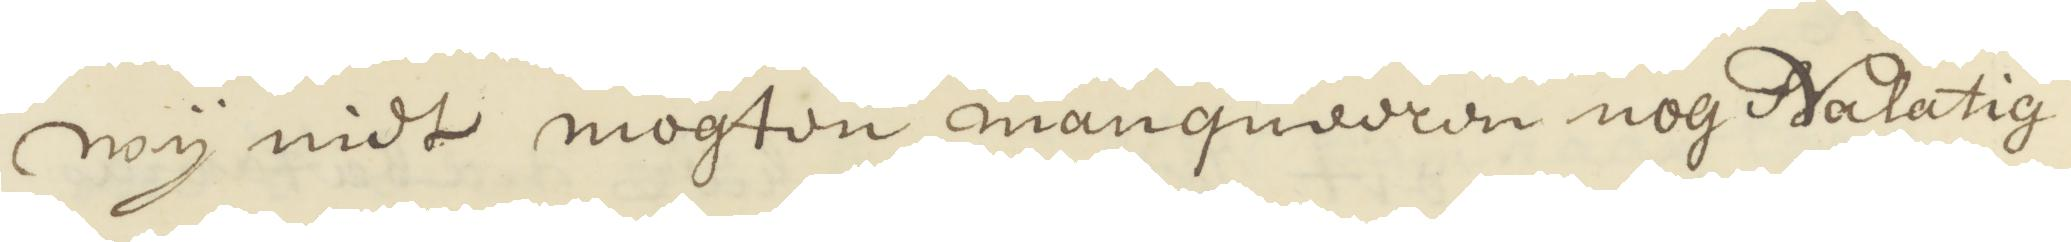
wij niet mogten manqueeren nog Nalatig
